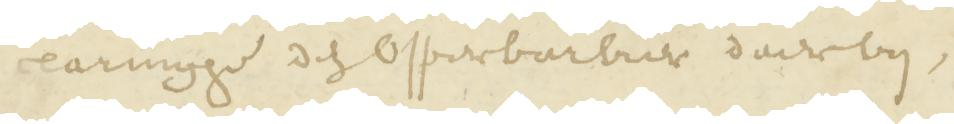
claringhe den opperbarbier daer bij,
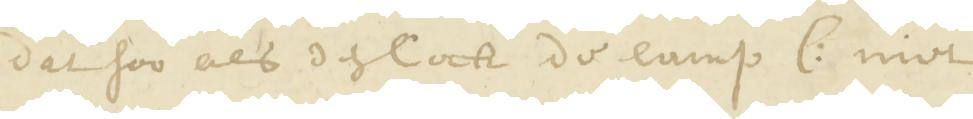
dat soo als den Cock de lamp (:niet
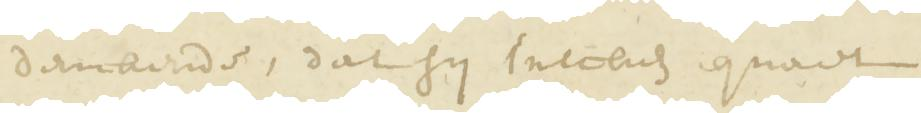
denckende, dat sij sulcken quaet
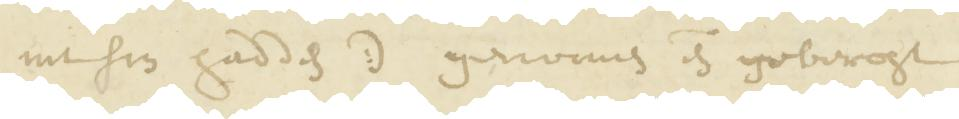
int sin hadden:) genomen en gebergt
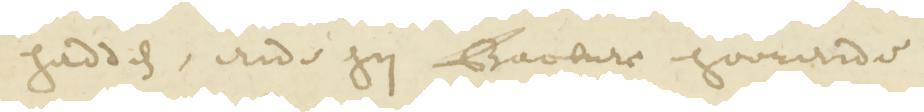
hadden, ende hij Backer hoorende
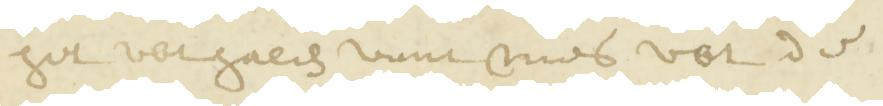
het wthalen vant mes wt de
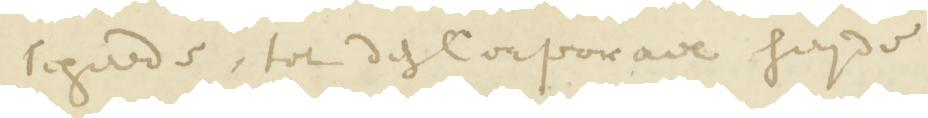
scheede, tot den Corporael seyde
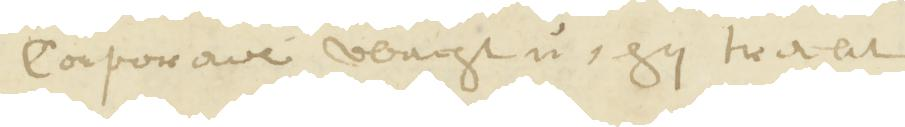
Corporael wacht u, hij treckt
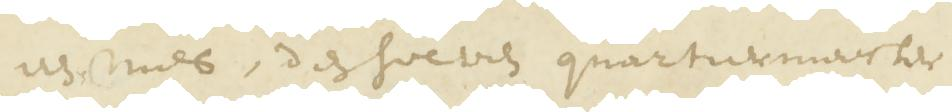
een mes, denselven quartiermeester
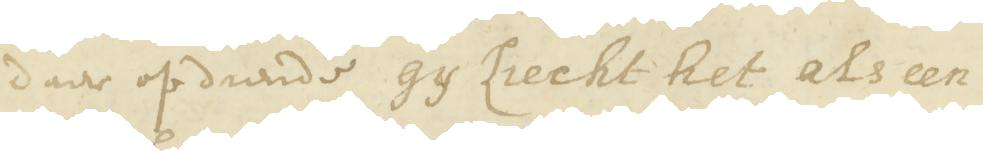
daer op diende gy Liecht het als een
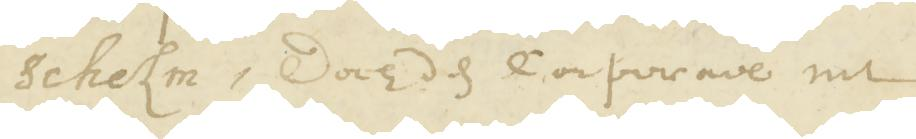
schelm, Doch den Corperael int
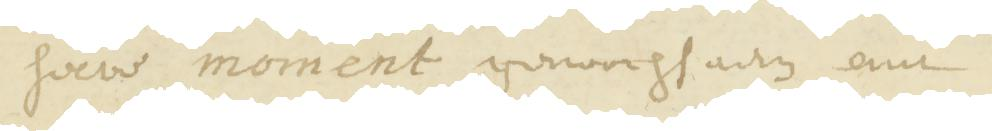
selve moment genoochsaem ant
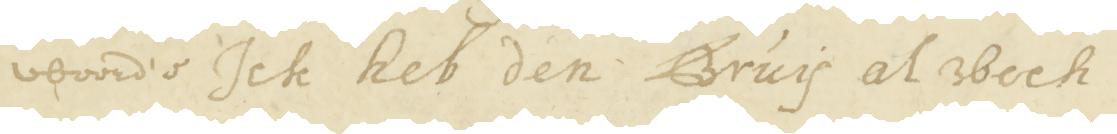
woord'e Ick heb den Bruij al wech
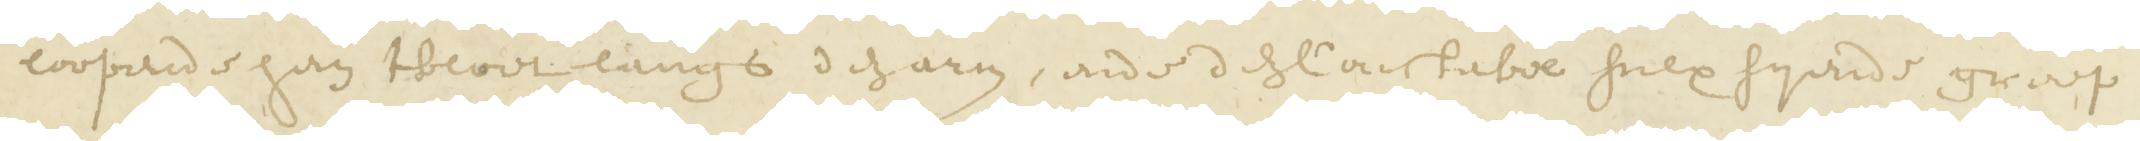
loopende hem tbloet langs den arm, ende den Constabel sulx syende greep
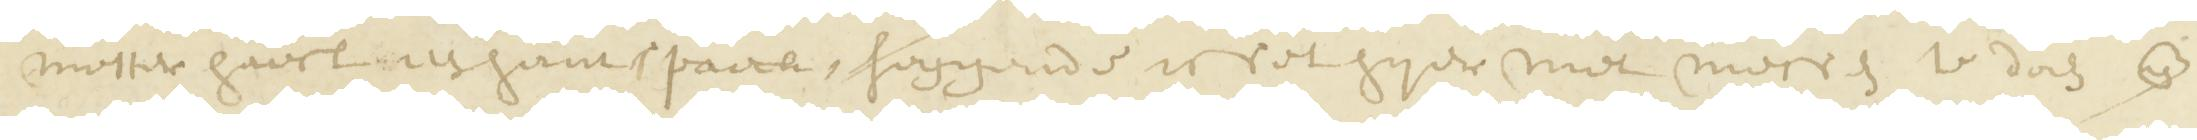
metter haest een hantspaeck, seggende isset hyer met messen te doen ende
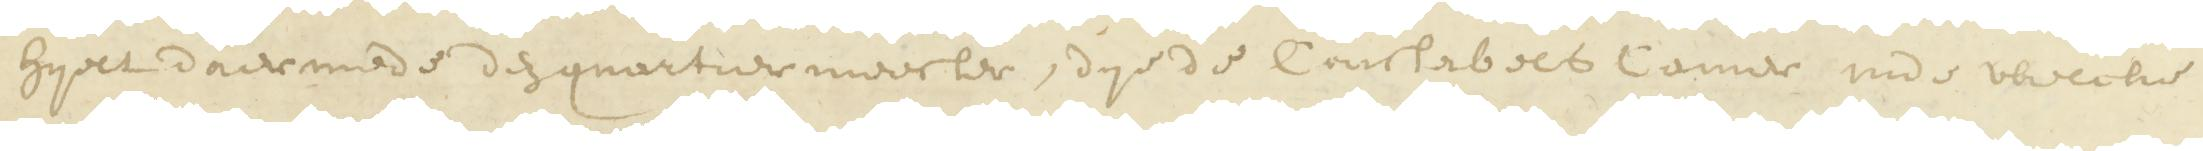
hyelt daer mede den quartier meester, dys de Constabels Camer inde welcke
